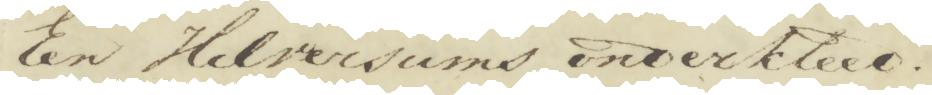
Een Hilversums onderkleed.
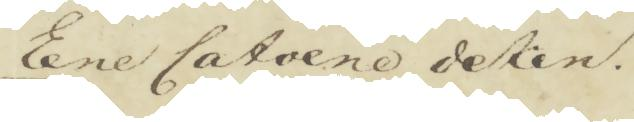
Eene Catoene deken.
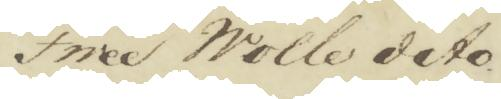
Twee Wolle dito
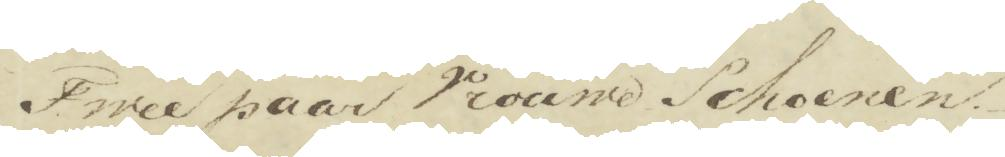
Twee paar Vrouwe schoenen.
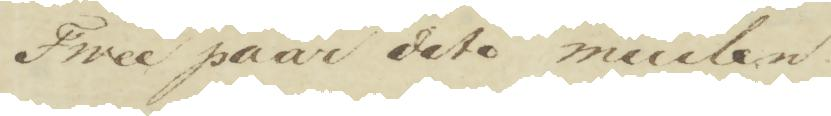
Twee paar dito muilen
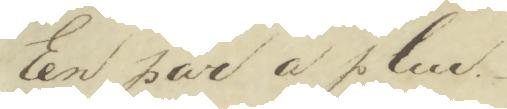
Een par a plui.
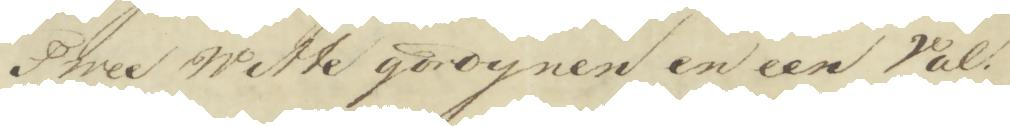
Twee Witte gordynen en een Val.
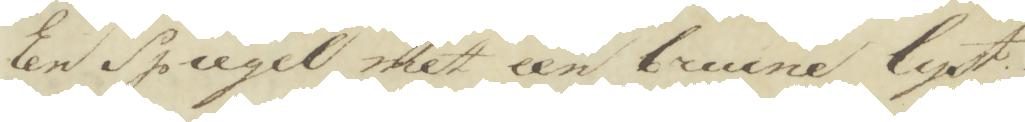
Een spiegel met een bruine lyst.
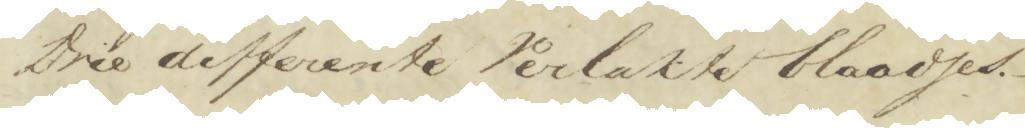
Drie differente Verlakte blaadjes.
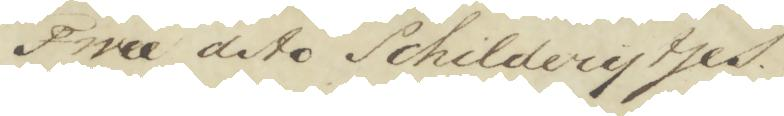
Twee dito schilderijtjes.
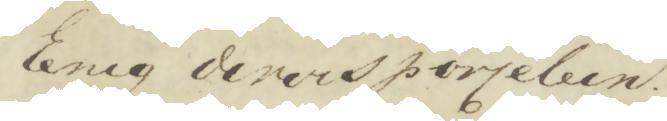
Eenig divers porcelein.
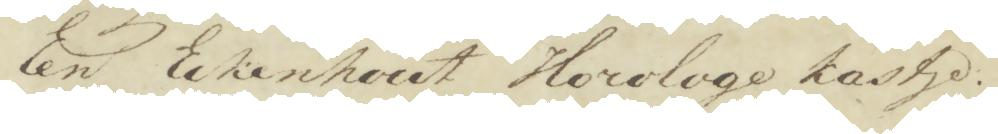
Een Eikenhout Horologe kastje.
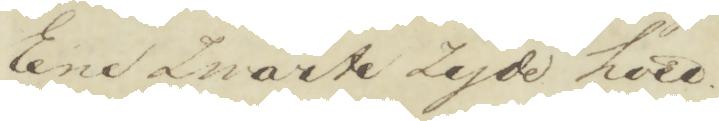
Eene zwarte zyde hoed
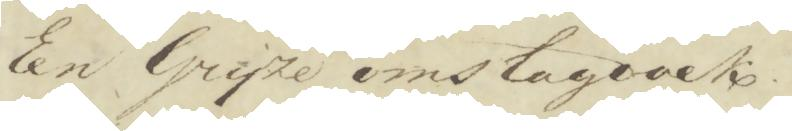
Een Gryze omslagdoek.
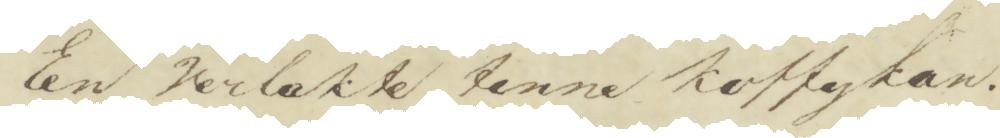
Een verlakte tinne koffykan.
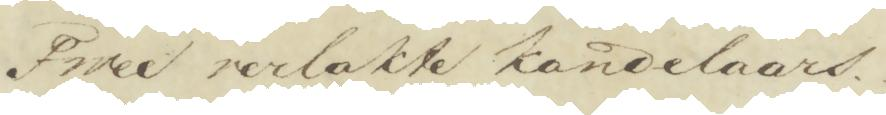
Twee verlakte kandelaars.
